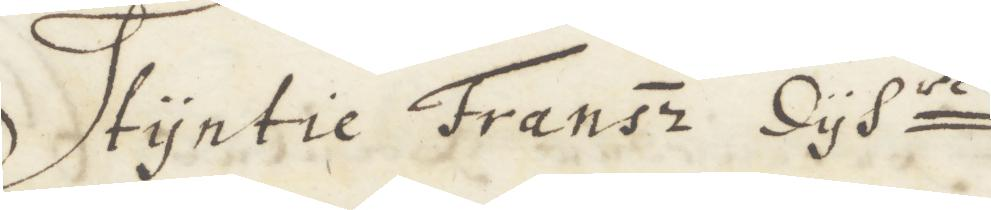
Stijntie Fransz Eijs=rce
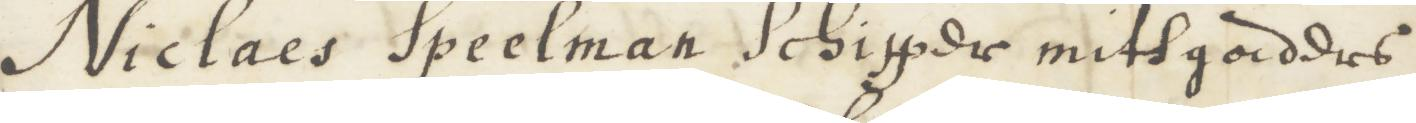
Niclaes speelman schipper mitsgaders
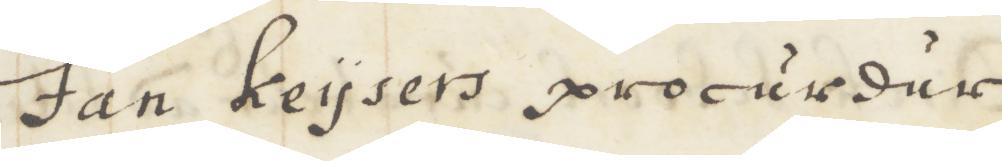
Ian keijsers procureur
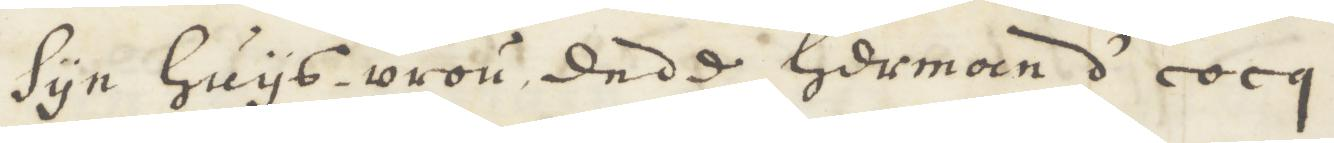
sijn huijs-vrou, ende herman d’ cocq
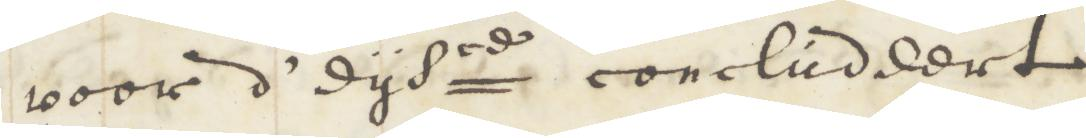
voor d’ Eijs=ce concludeert
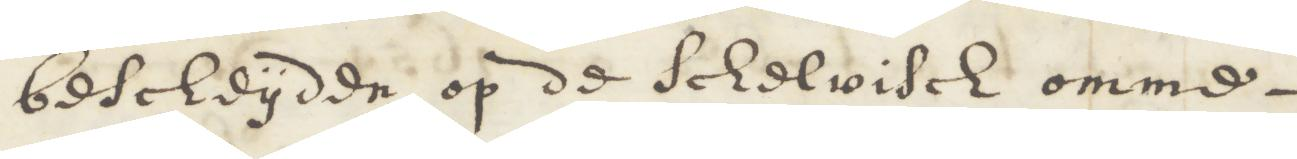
bescheijden op de schelvisch omme —
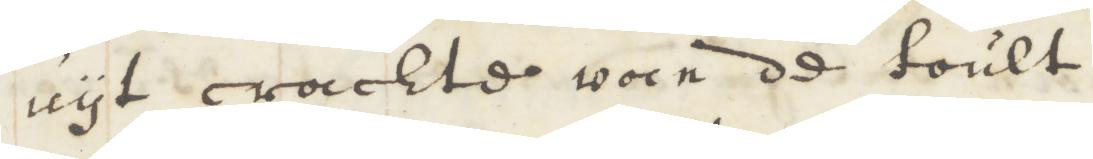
uijt crachte van de foult
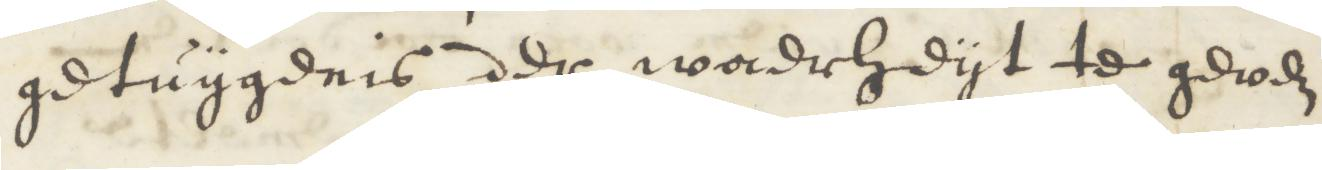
getuijgenis der waerheijt te geven
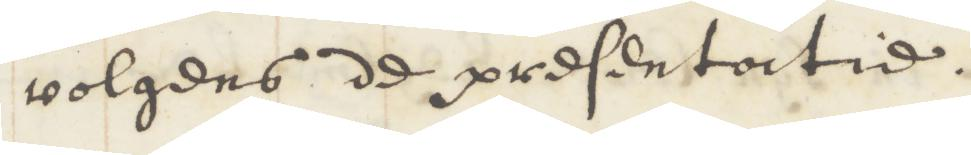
volgens de presentatie.
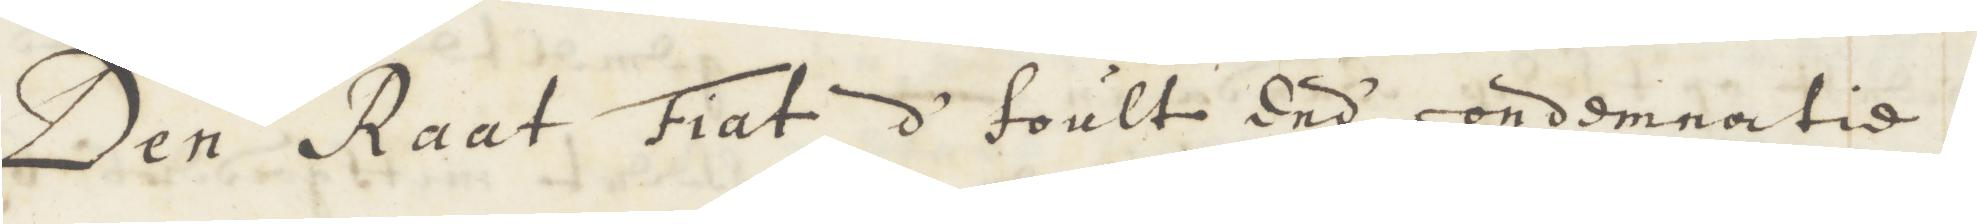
Den Raat Fiat d’ foult End condemnatie —
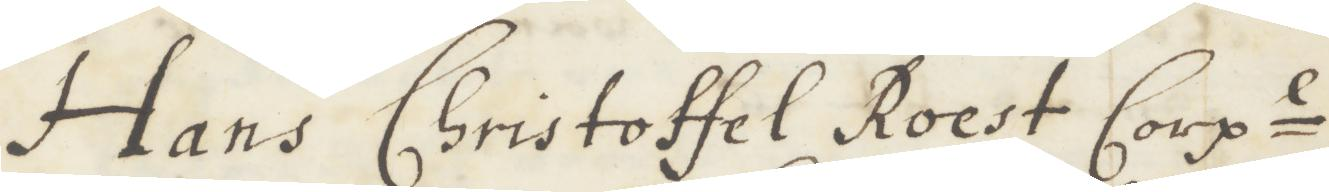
Hans Christoffel Roest Corp=l
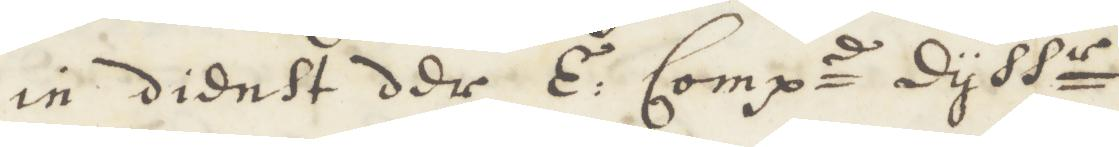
in dienst der E: Comp=e Eijss=r
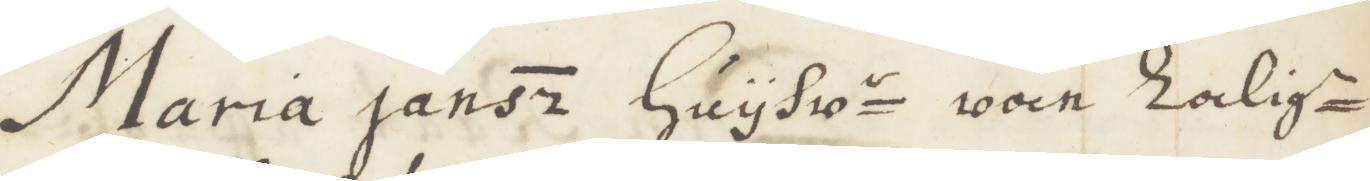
Maria jansz huijsv=r van zalig=r
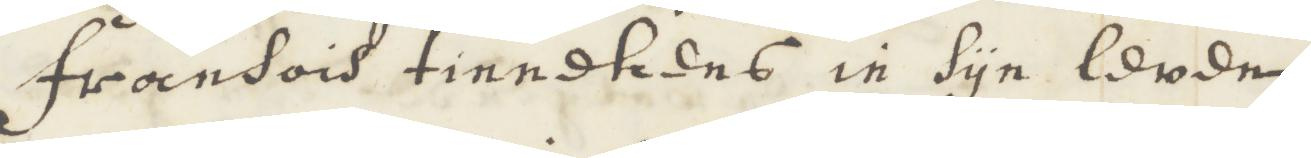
fransois tinnekens in sijn leven
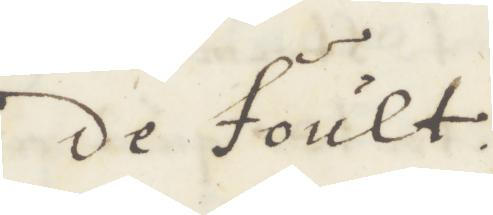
Pr=mo de foult.
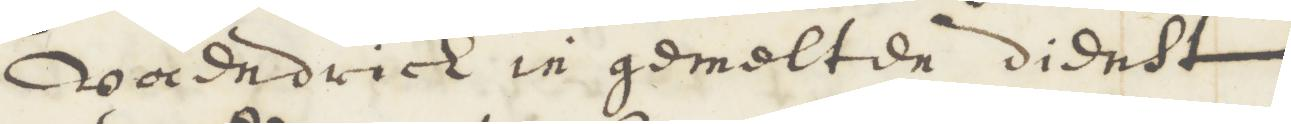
Vaendrich in gemelten dienst
